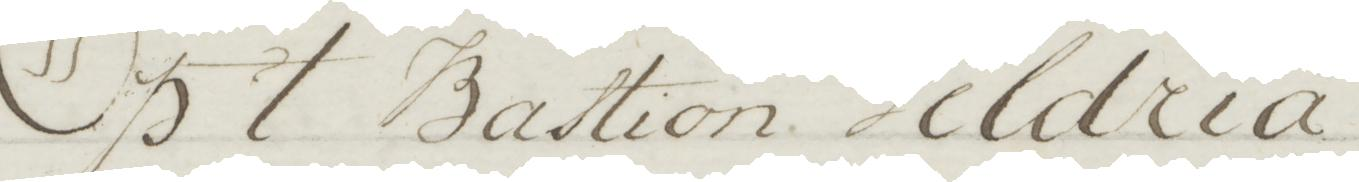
Op 't Bastion Geldria
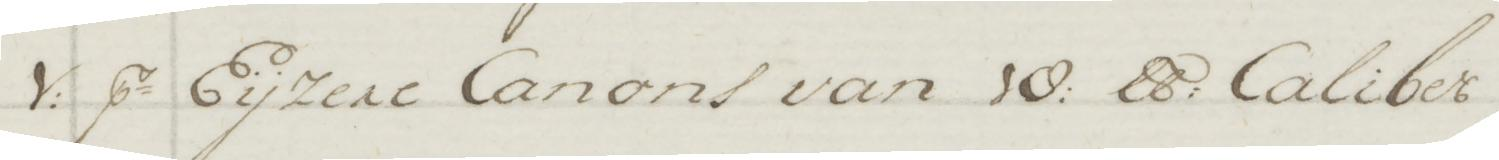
1: p=s Eijzere Canons van 18: lb: Caliber
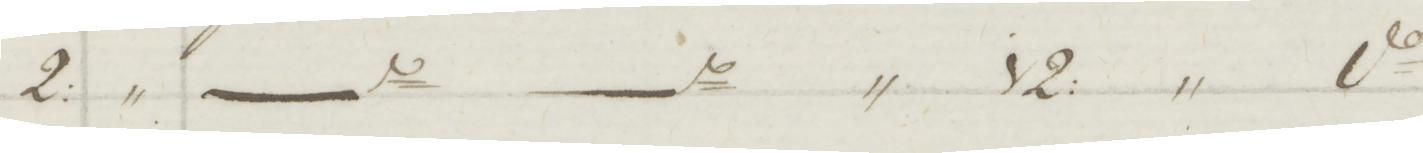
2: „ _=o _=o „ 12: „ d=o
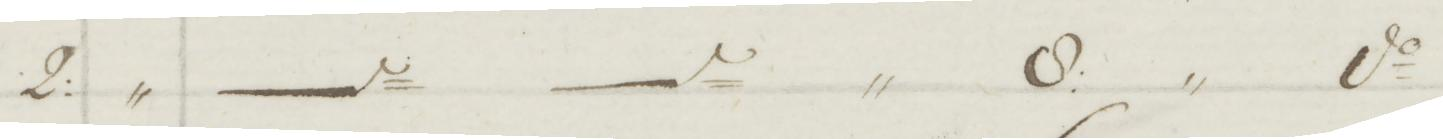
2: „ _=o _=o „ 8: „ d=o
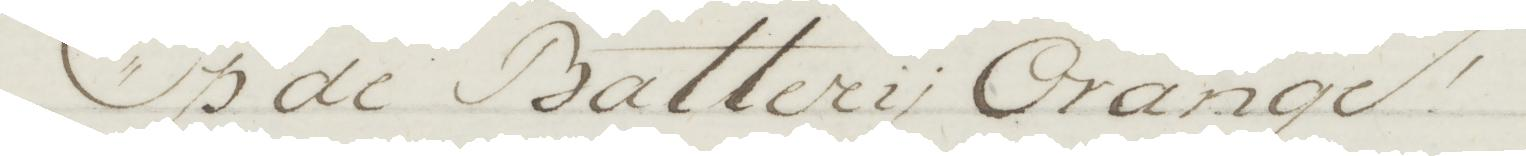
Op de Batterij Orange!
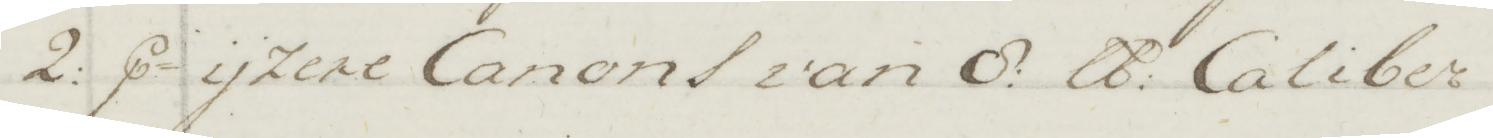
2: p=s ijzere Canons van 8: lb: Caliber
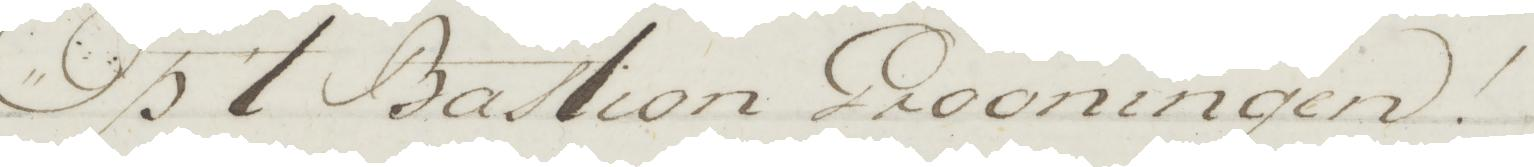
Op ’t Bastion Grooningen!
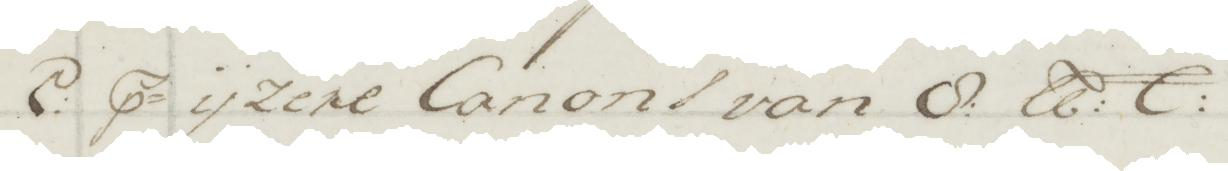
5: p=s ijzere Canons van 8: lb: C:
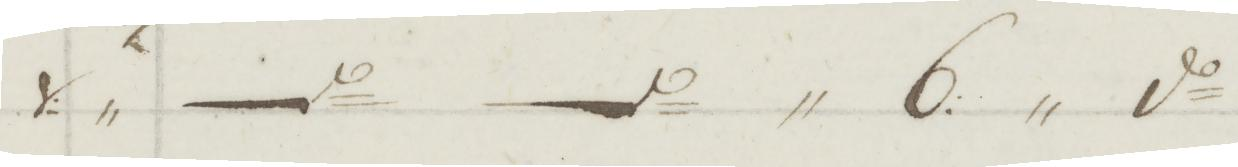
1: „ _=o _=o „ 6: „ d=o
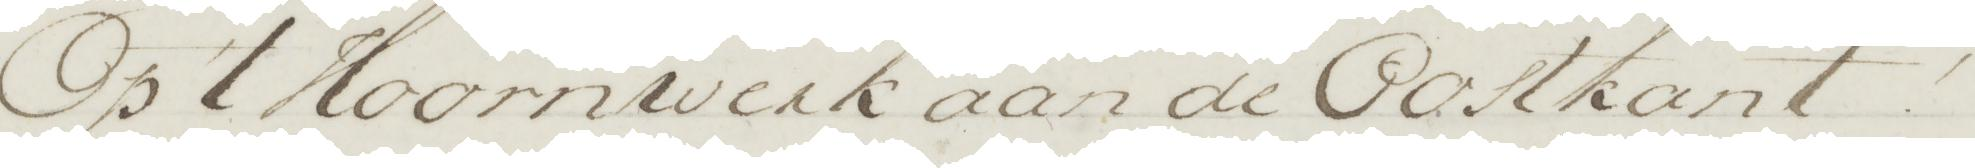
Op ’t Hoornwerk aan de Oostkant!
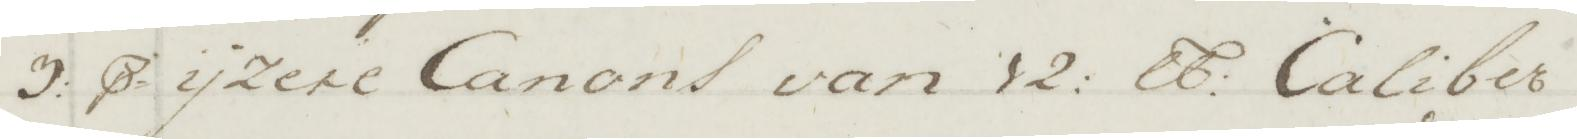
3: p=s ijzere Canons van 12: lb: Caliber
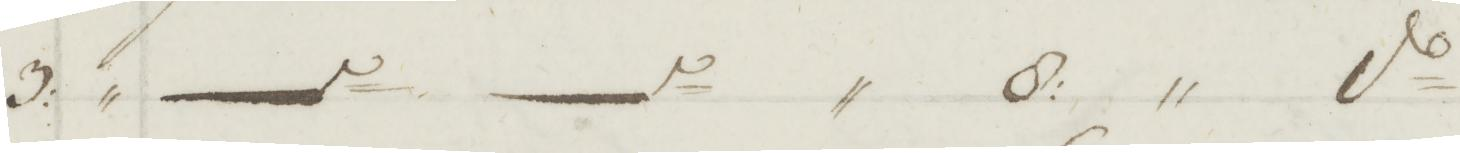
3: „ _=o _=o „ 8: „ d=o
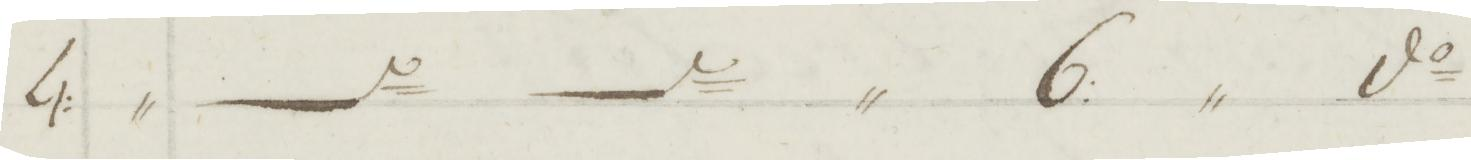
4: _=o _=o „ 6: „ d=o
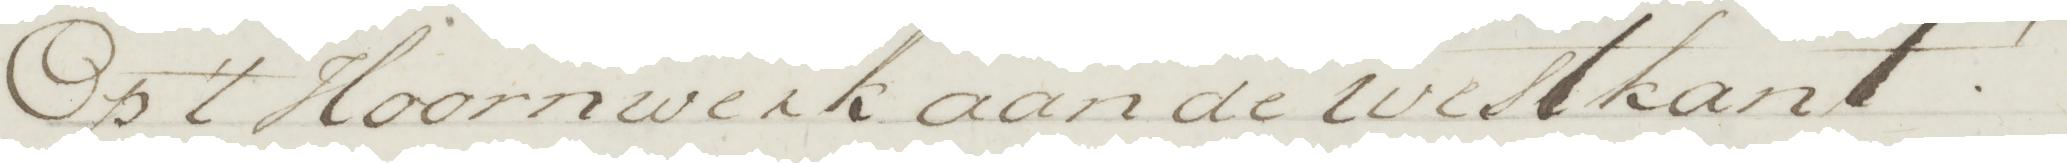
Op ’t Hoornwerk aan de westkant!
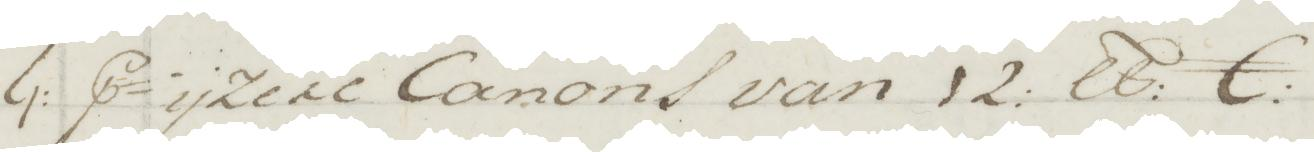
4: p=s ijzere Canons van 12: lb: C:
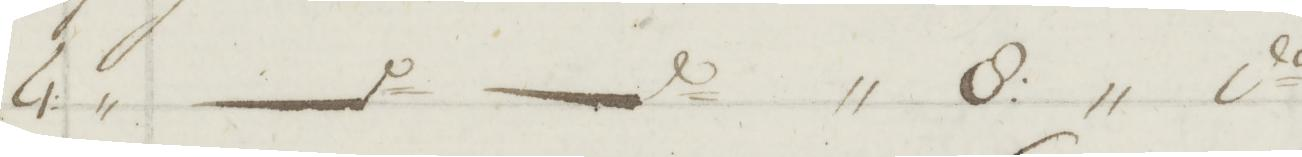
4: „ _=o _=o „ 8: „ d=o
